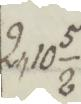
2„10 5/8
